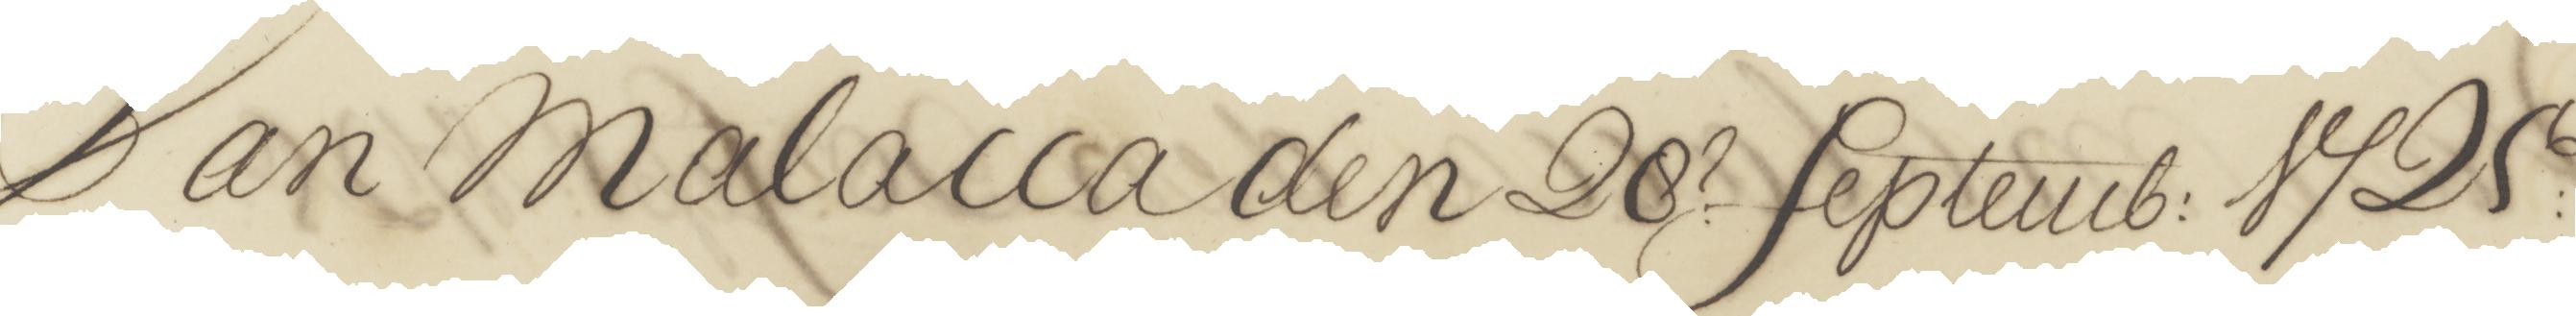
Van Malacca den 28:' Septemb: 1725:
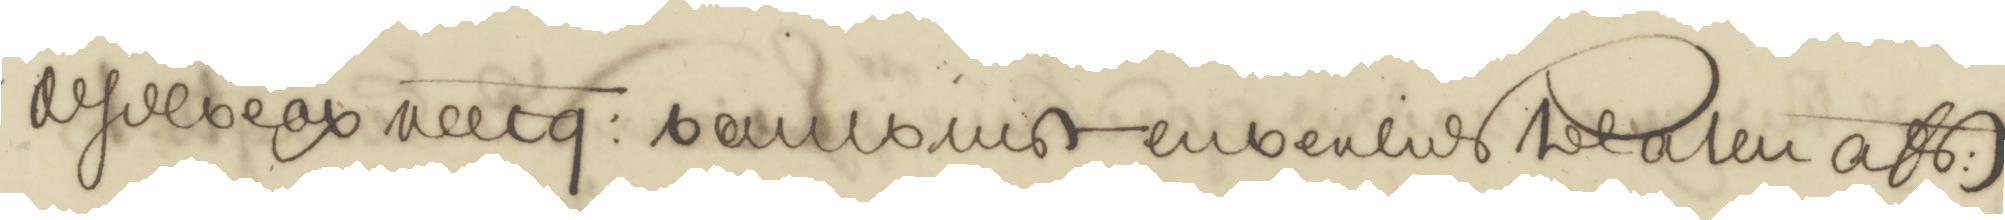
deselve op reecq: van winst en verlies te laten afs:
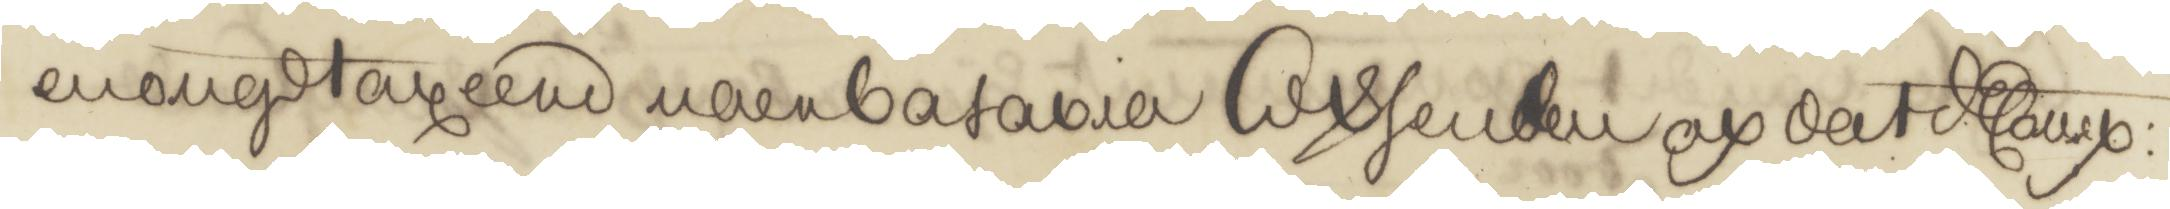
en ongetaxeerd naer batavia te versenden op dat d EComp:
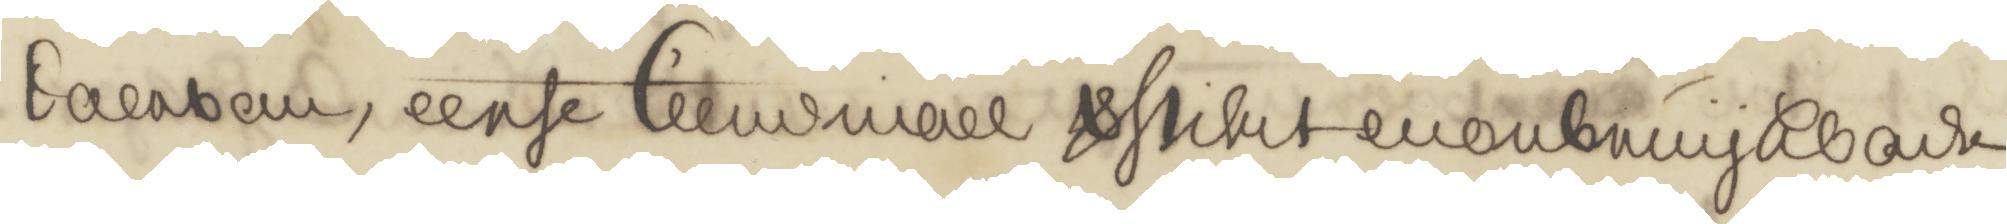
daervan, eerse t'eene mael verstikt en onbruijkbaer
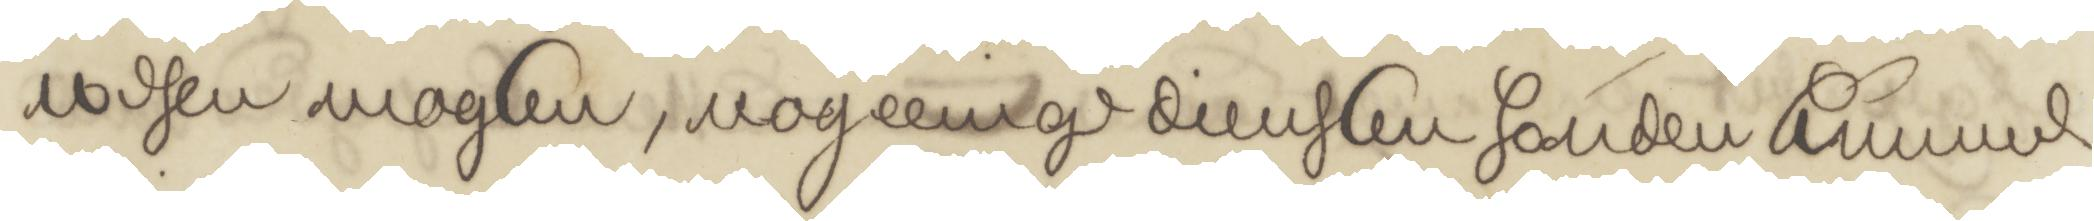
wesen mogten, nog eenige diensten souden kunnen
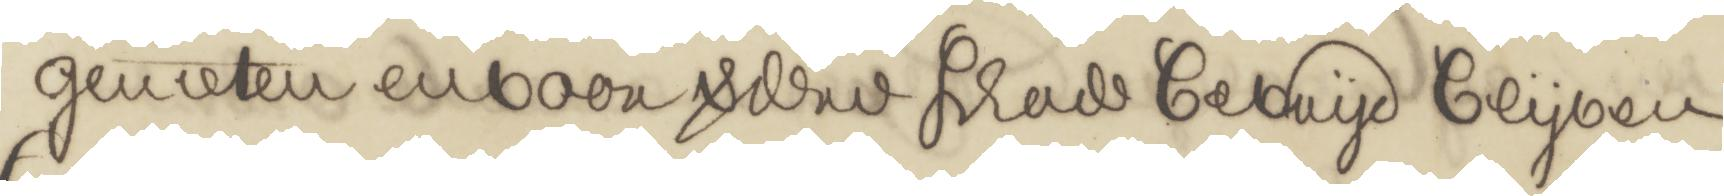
genieten en voor verdere schade bevrijd blijven
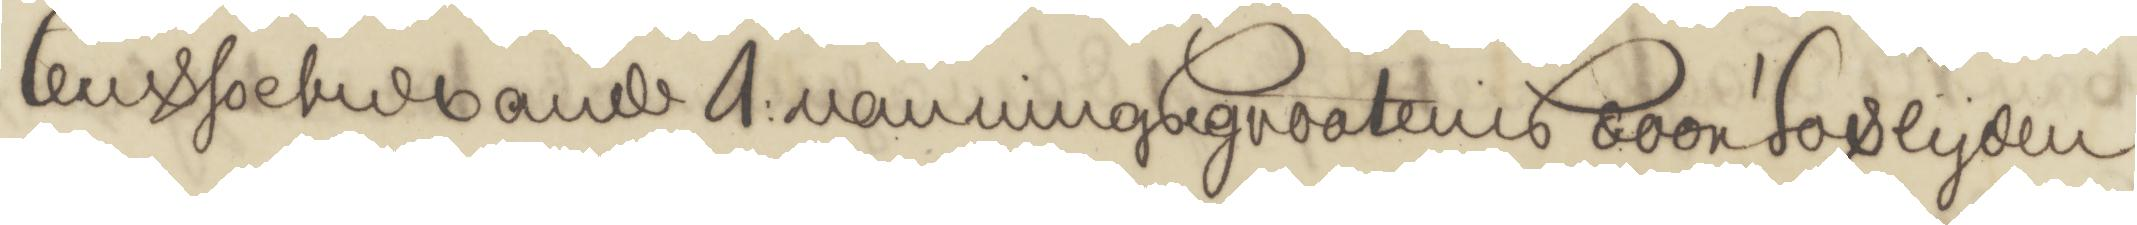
ten versoeke vande 4: nanningse grooten is door 'toverlijden
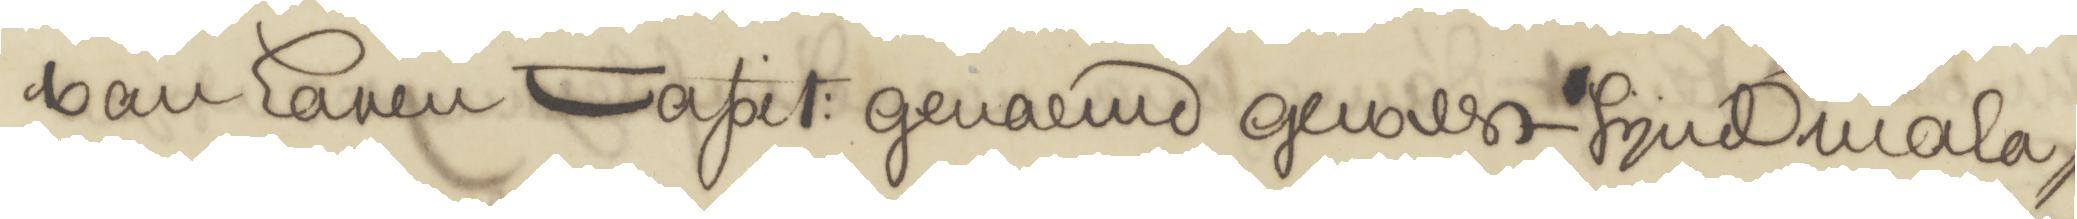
van haren Capit: genaemd geweest sijnde mala„
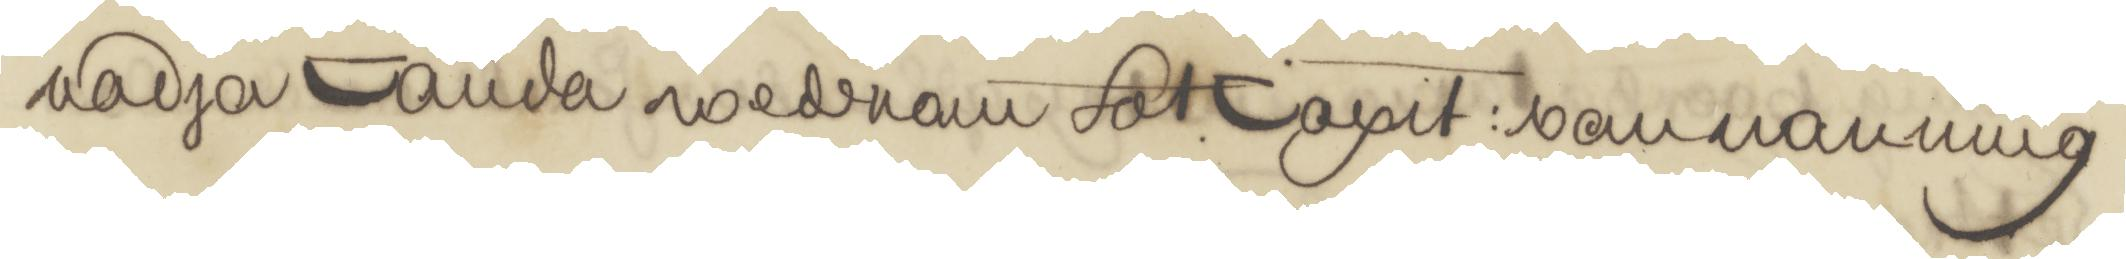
radja Canda wederom tot Capit: van nanning
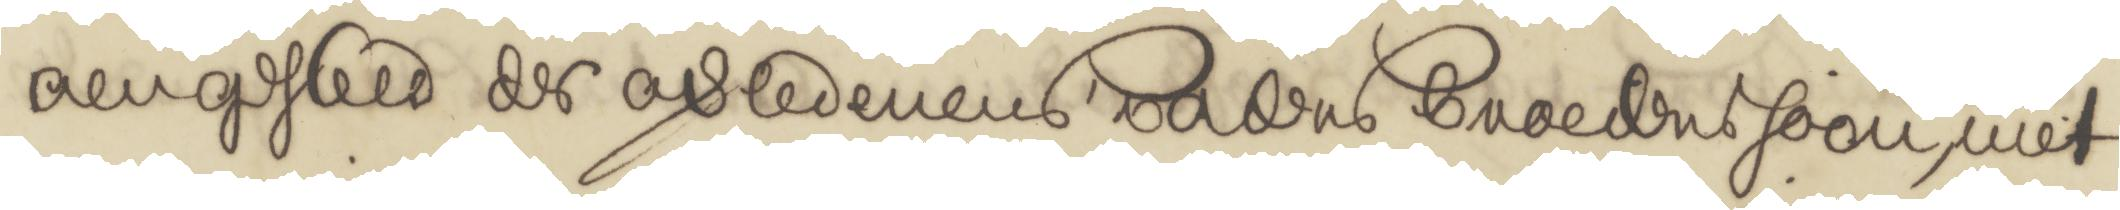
aengesteld des overledenens' vaders broederssoon, met
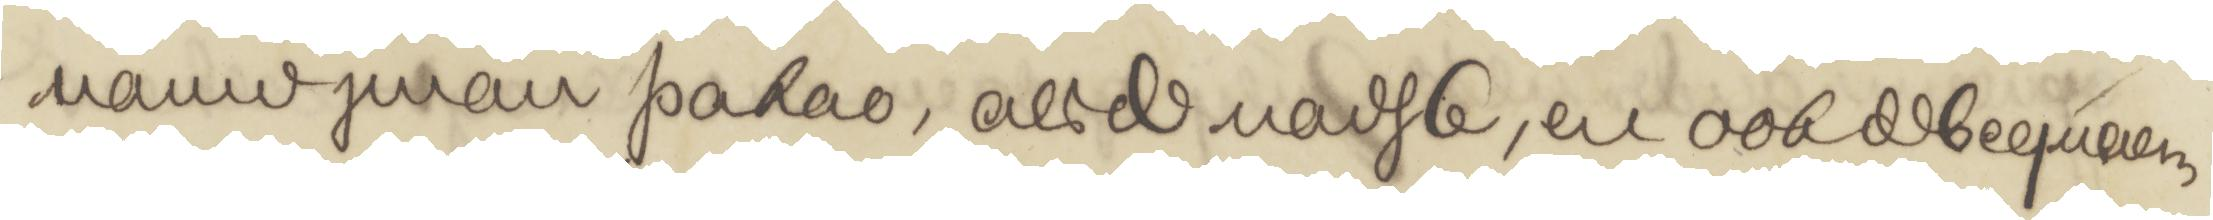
name jman pakao, als de naeste, en ook de bequaem
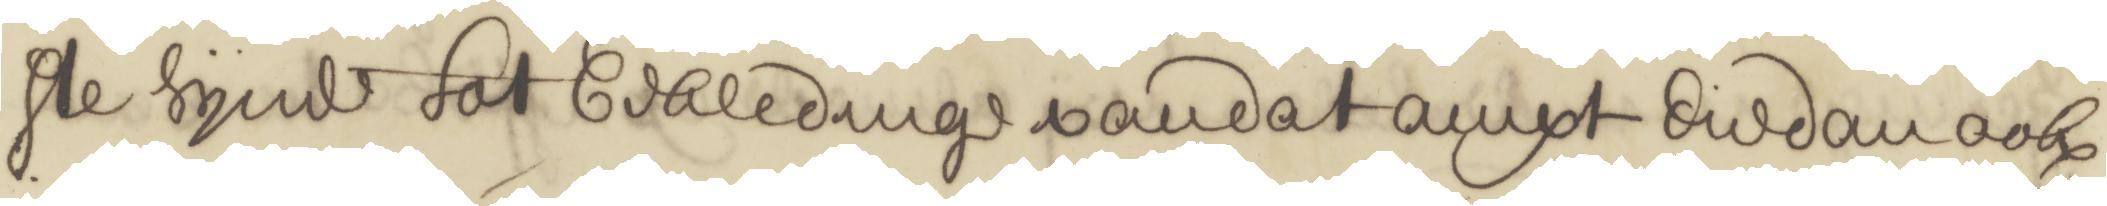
ste sijnde tot bekledinge van dat ampt die dan ook
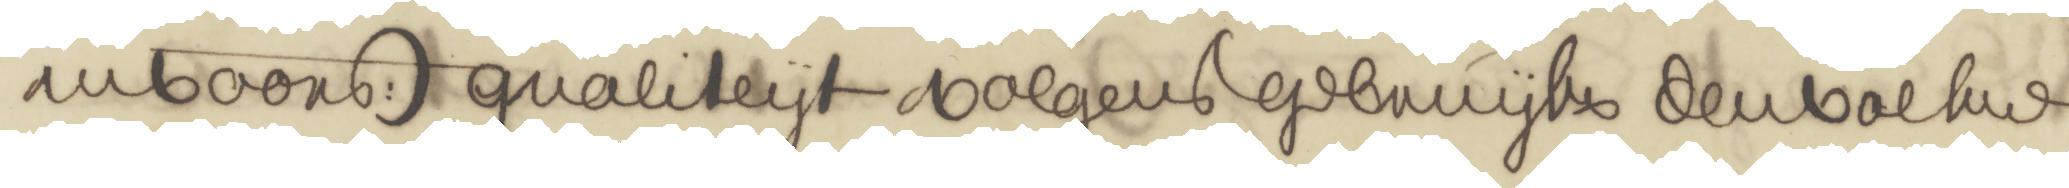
in voors: qualiteijt volgens gebruijk den volke
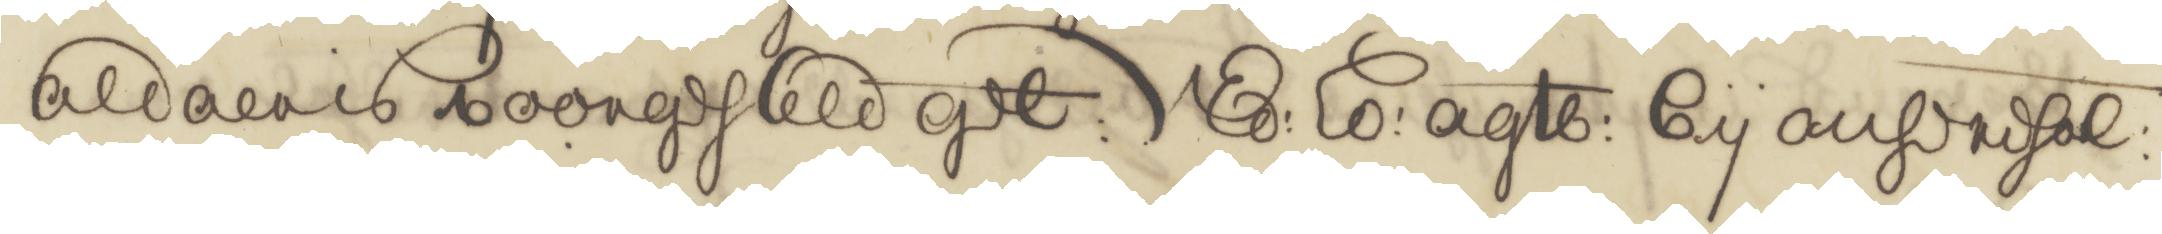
aldaer is voorgesteld gelijk UEd: ho: agtb: bij onse resol:
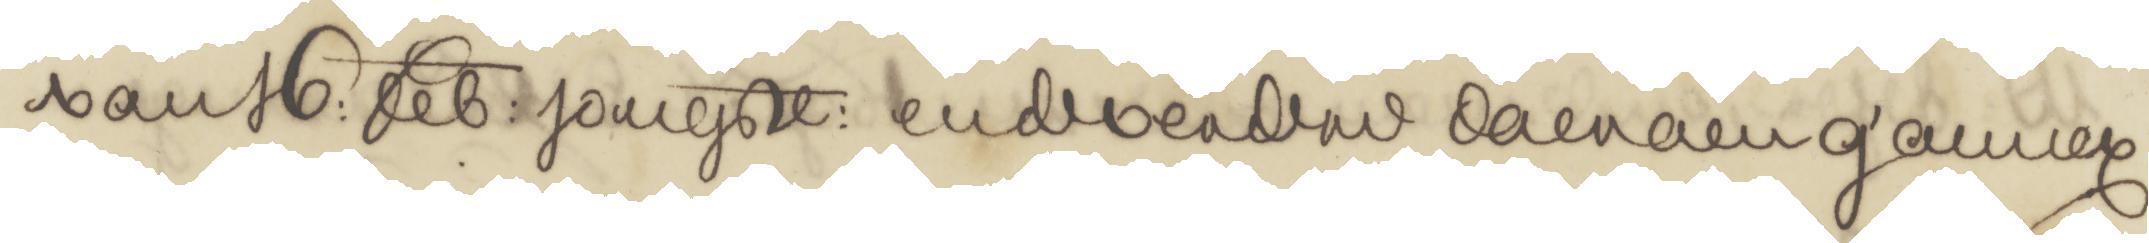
van 16: feb: jongstl: ende verdere daer aen g'annex
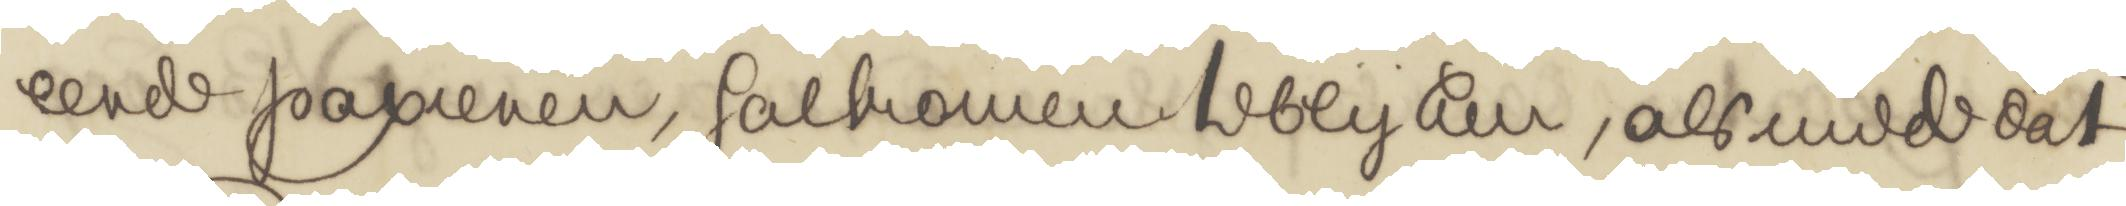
eerde papieren, sal komen te blijken, als mede dat
